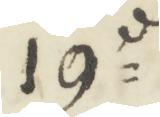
19=e
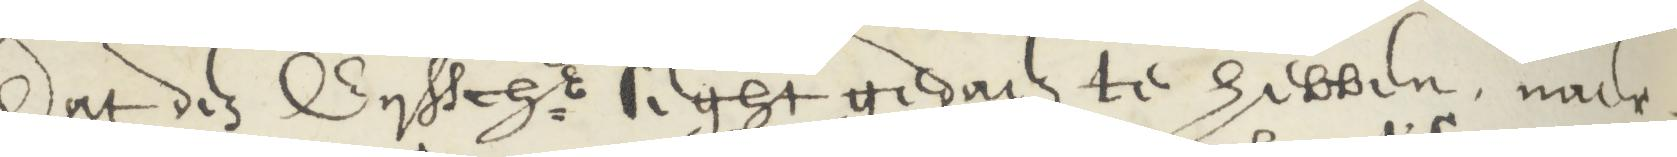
dat den Eyssch=r seght gedaen te hebben, naer
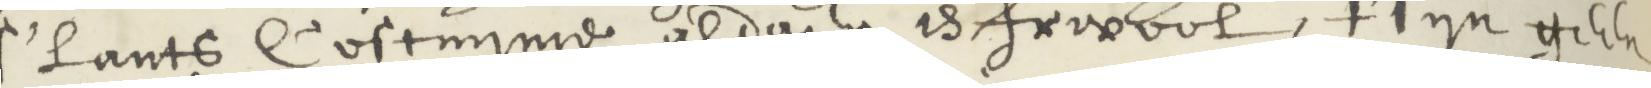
s'lants Costuyme aldaer is frivool, t' syn geen
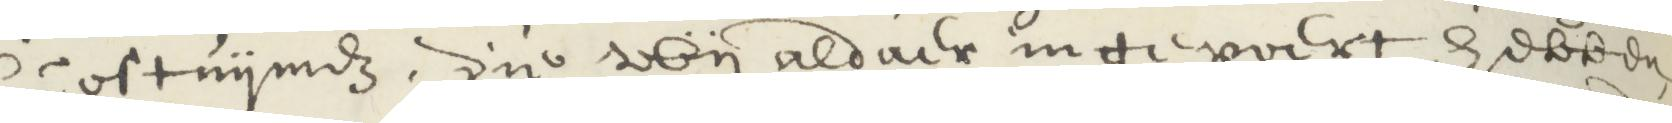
Costuijmen, die wij aldaer in gevoert hebben,
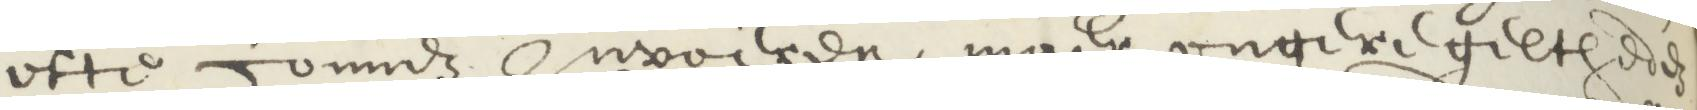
ofte connen Jnvoeren, maer ongeregeltheden
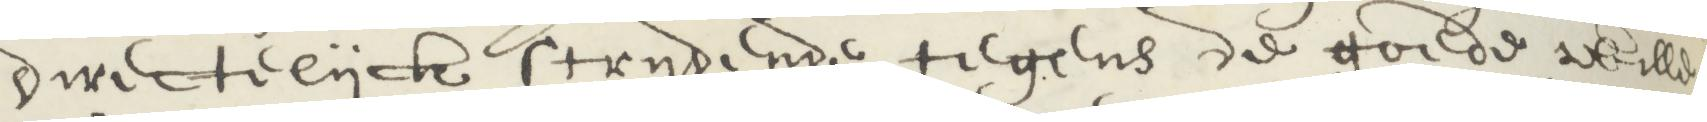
directelijck strydende tegens de goede wille
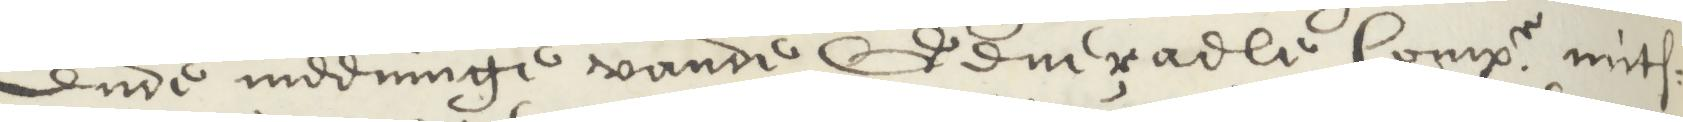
ende meeninge vande generaele Comp.e mits
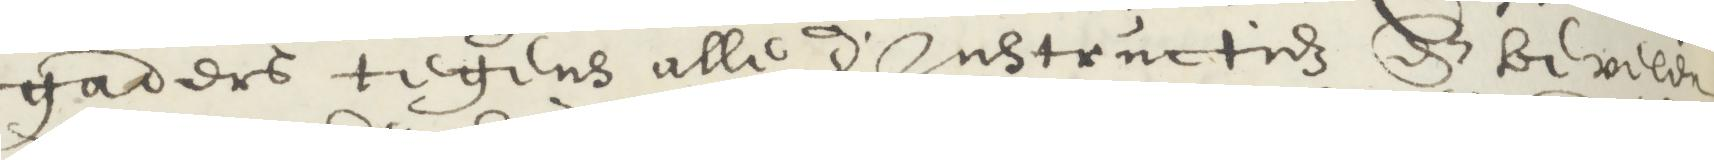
gaders tegens alle d’ Jnstructien ende bevelen
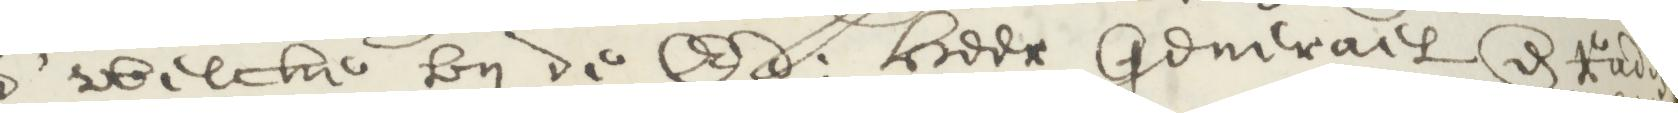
welcke by de Ed: heer Generael ende raden
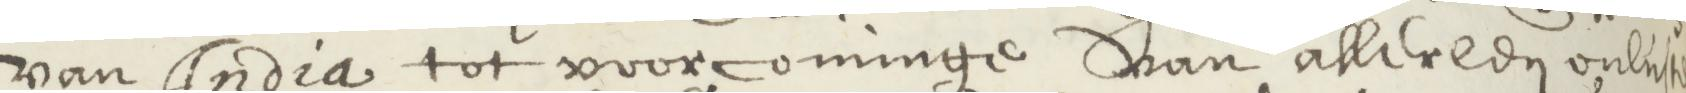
van Jndia tot voorcominge van allerley onlusten
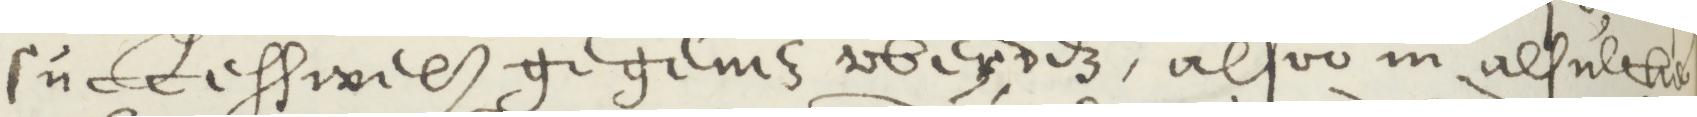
successivelijk gegeuen werden, alsoo in alsulcke
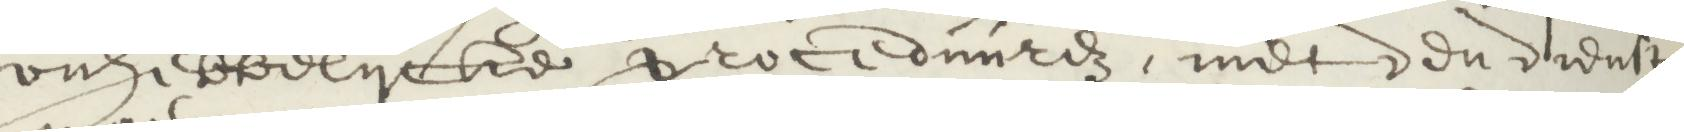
onhebbelycke proceduuren, niet den dienst
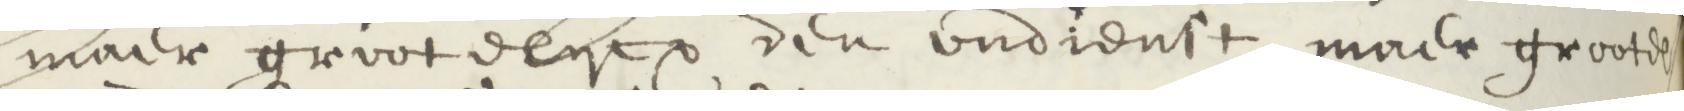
maer grootelycx den ondienst maer grootel
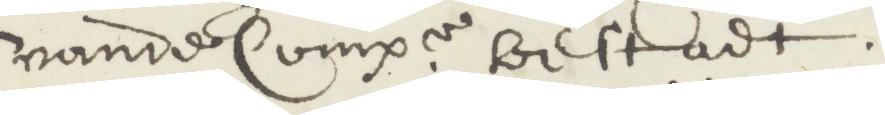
vande Comp.e bestaet.
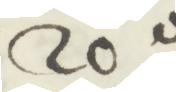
20=e
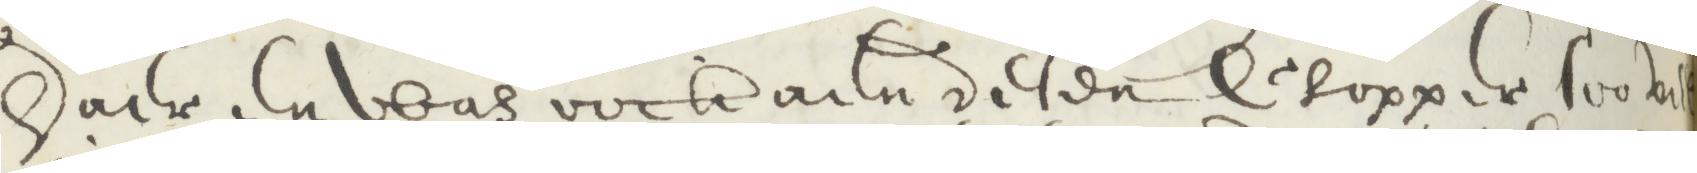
Daer en was oock aen desen Clopper soo
